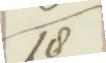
5/18
